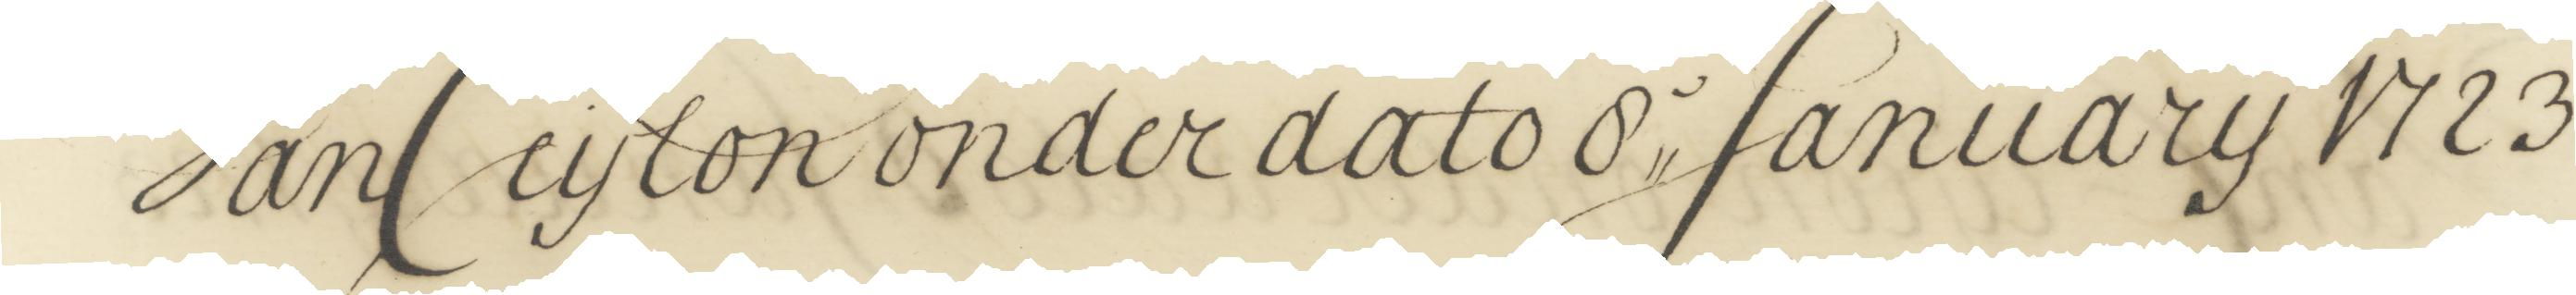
Van Ceijlon onder dato 8„' Januarij 1723
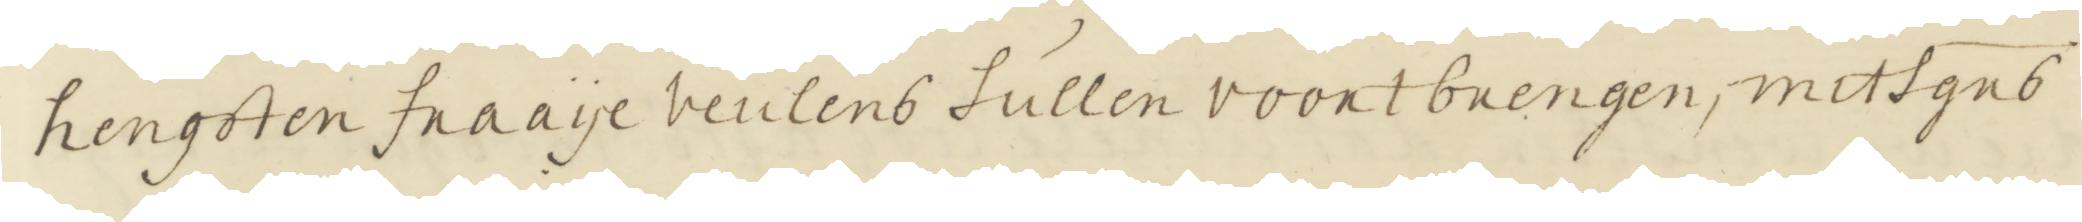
hengsten fraaije veulens sullen voortbrengen, mitsgrs
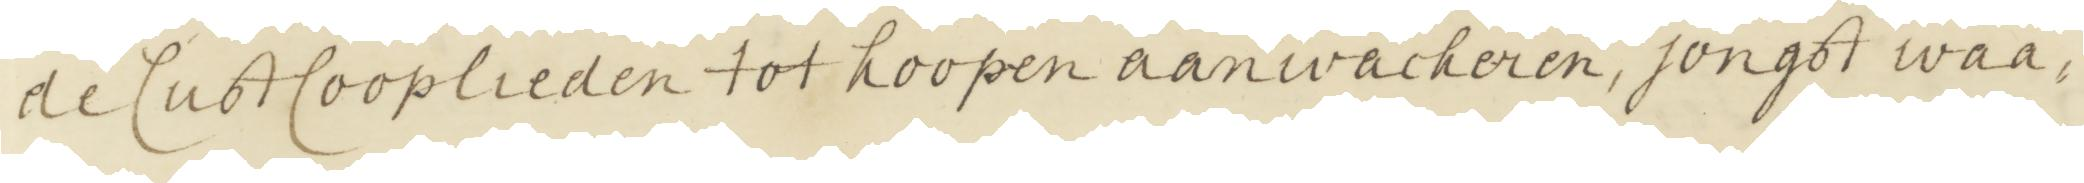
de custcooplieden tot koopen aanwackeren, jongst waa„
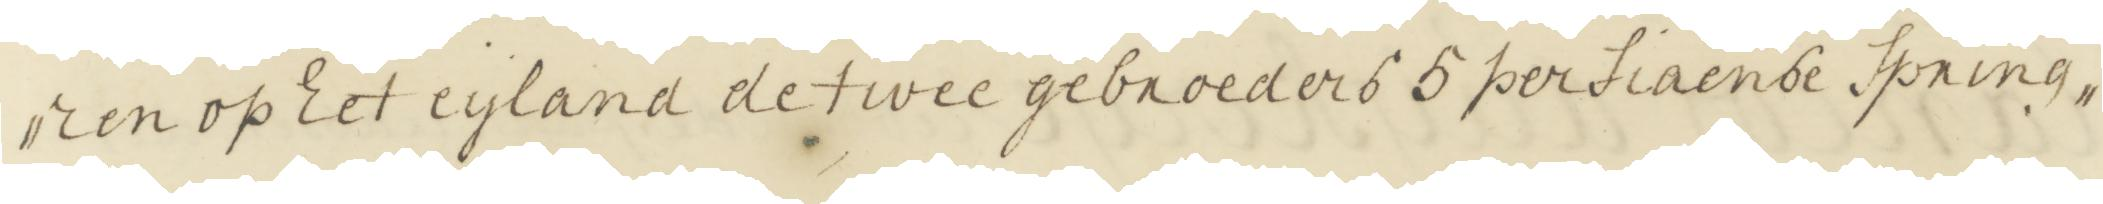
„ren op het eijland de twee gebroeders 5 persiaense spring„
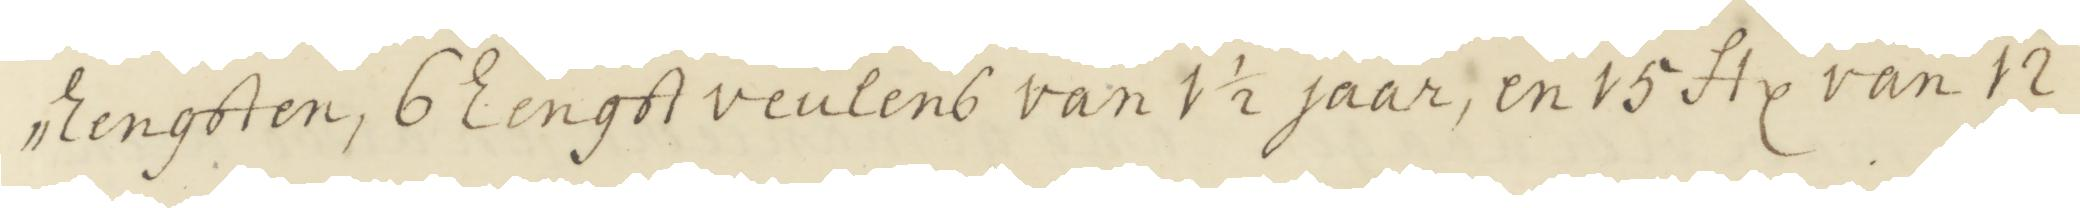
„hengsten, 6 hengstveulens van 1½ jaar, en 15 stx van 12
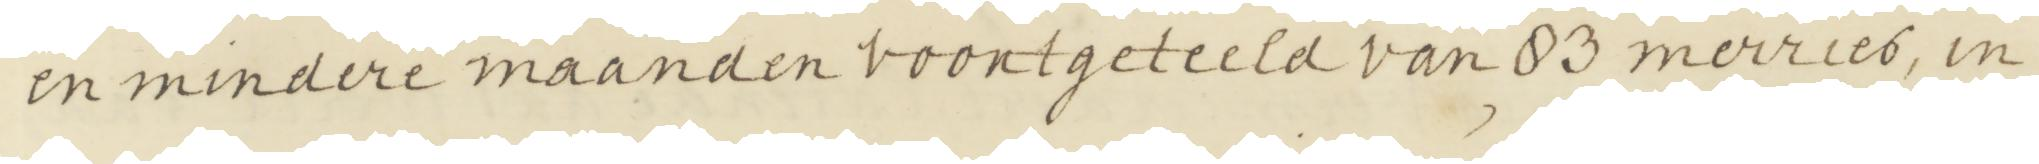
en mindere maanden voortgeteeld van 83 merries, in
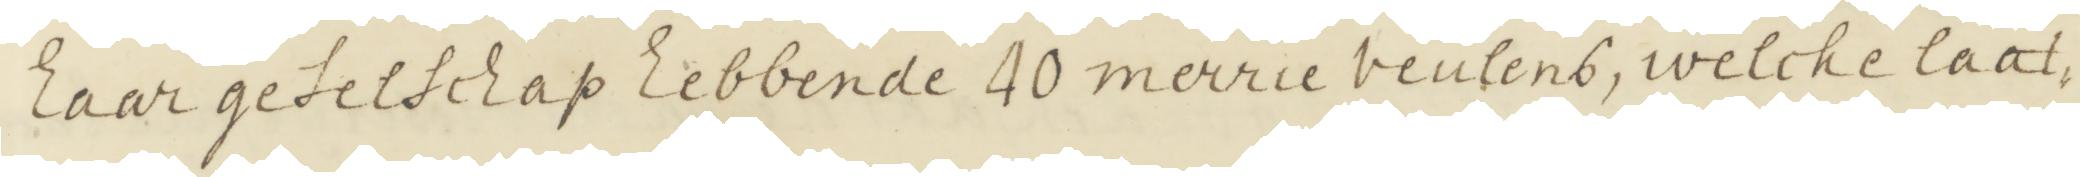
haar geselschap hebbende 40 merrie veulens, welcke laat„
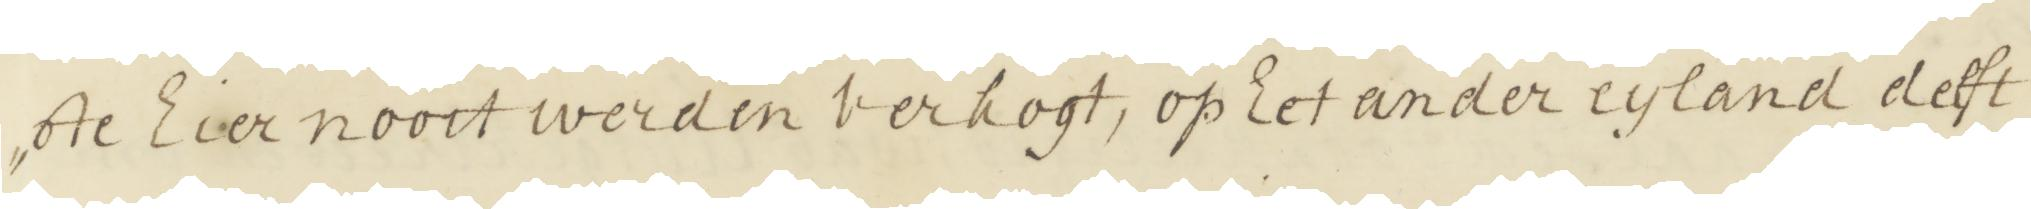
„ste hier nooit werden verkogt, op het ander eyland delft
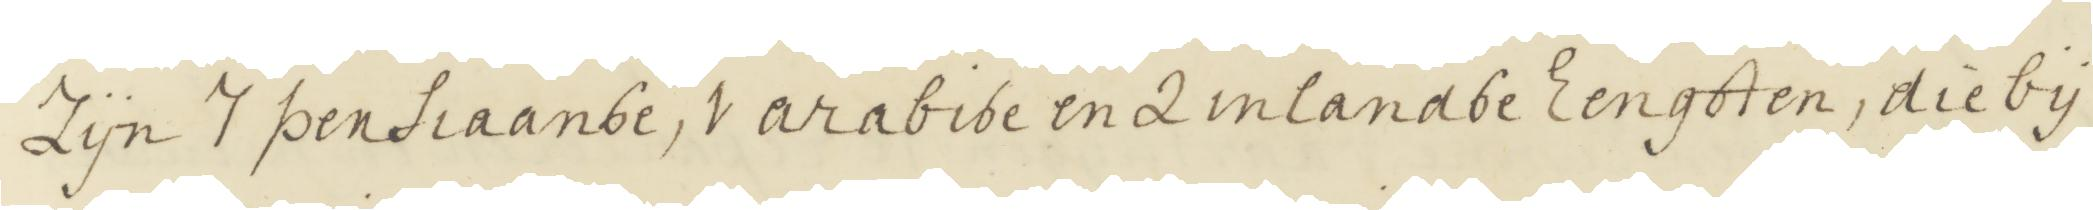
zijn 7 persiaanse, 1 arabise en 2 inlandse hengsten, die bij
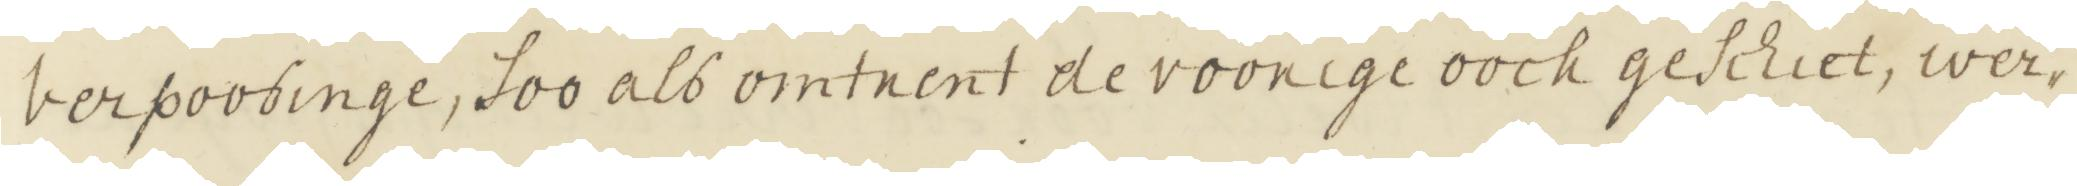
verpoosinge, soo als omtrent de voorige oock geschiet, wer„
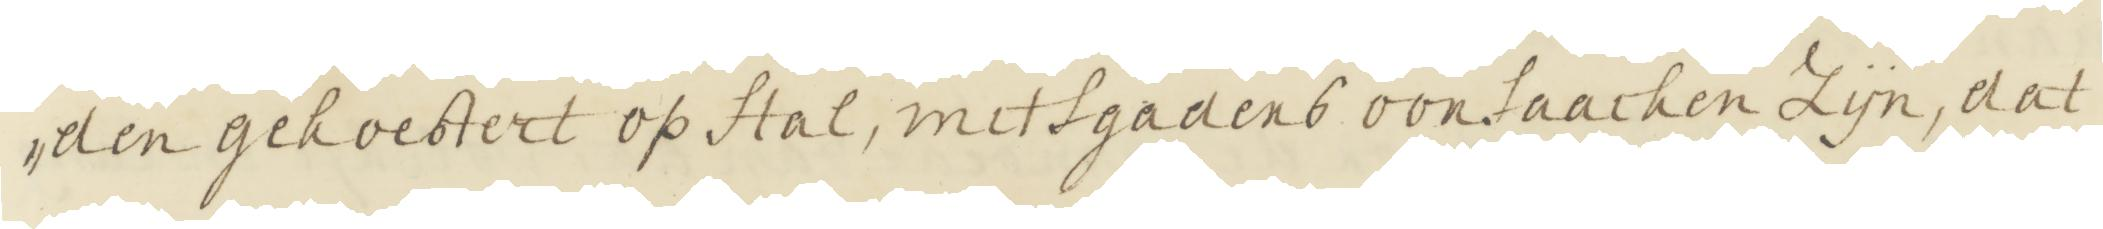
„den gekoestert op stal, mitsgaders oorsaacken zijn, dat
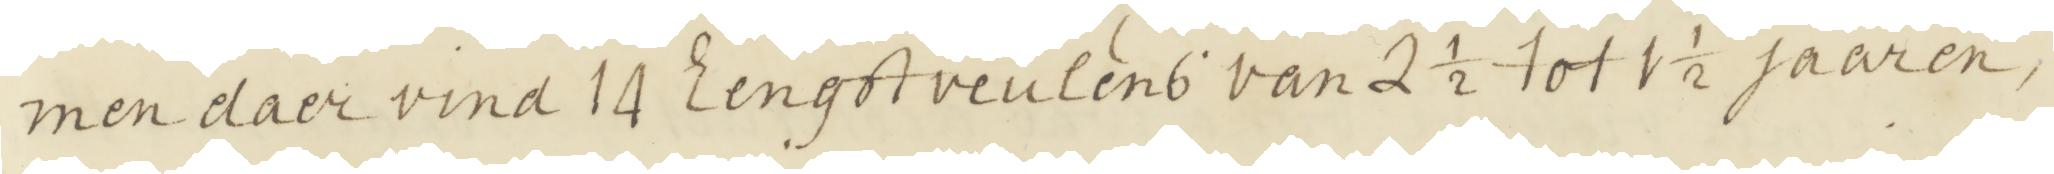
men daer vind 14 hengstveulens van 2½ tot 1½ jaaren,
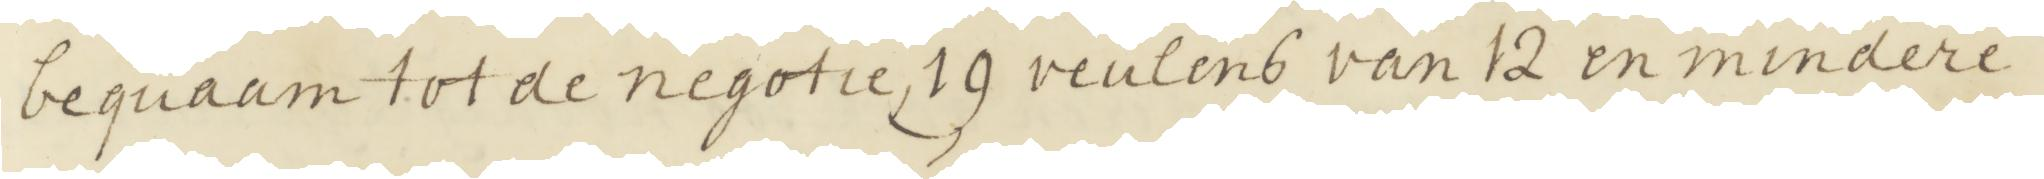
bequaam tot de negotie, 19 veulens van 12 en mindere
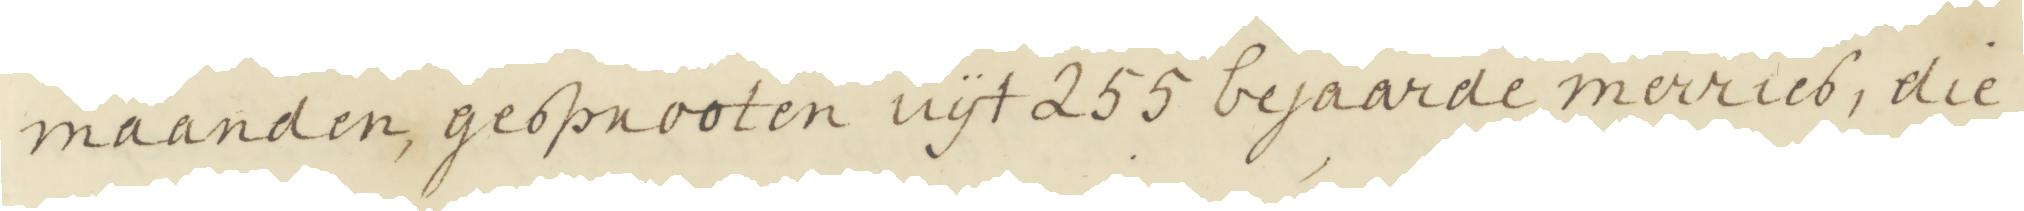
maanden, gesprooten uijt 255 bejaarde merries, die
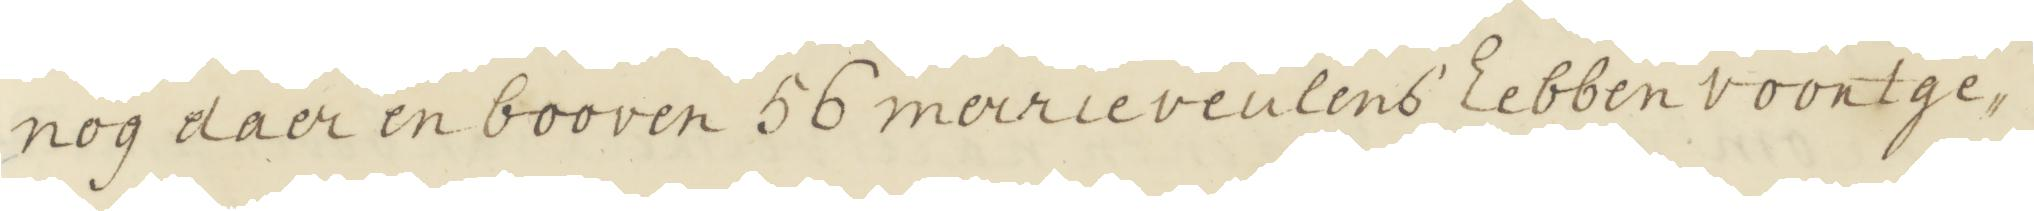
nog daer en booven 56 merrieveulens hebben voortge„
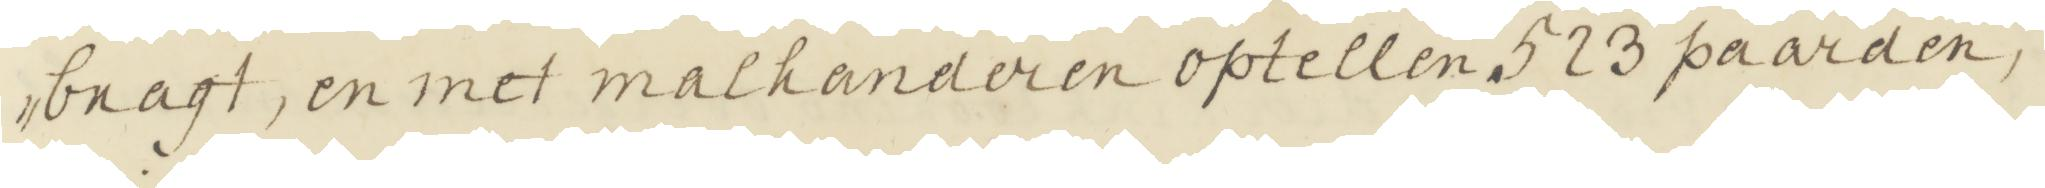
„bragt, en met malkanderen optellen 523 paarden,
